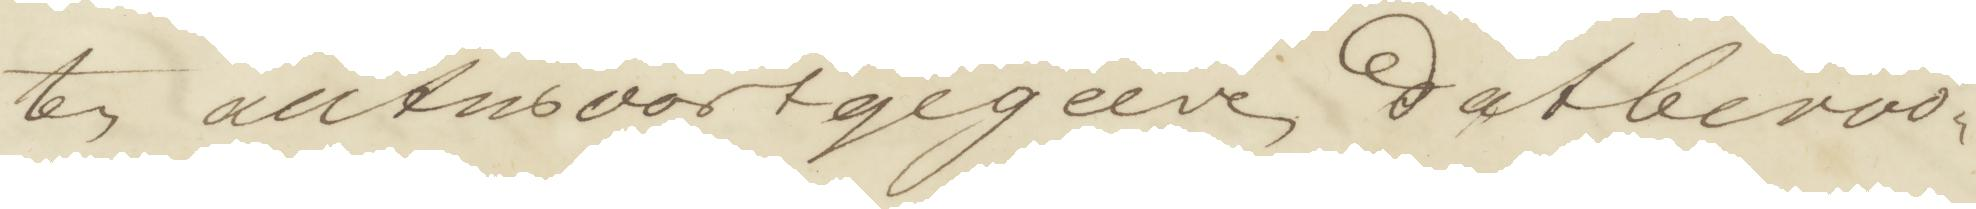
ten antwoort gegeeven dat bevoo„
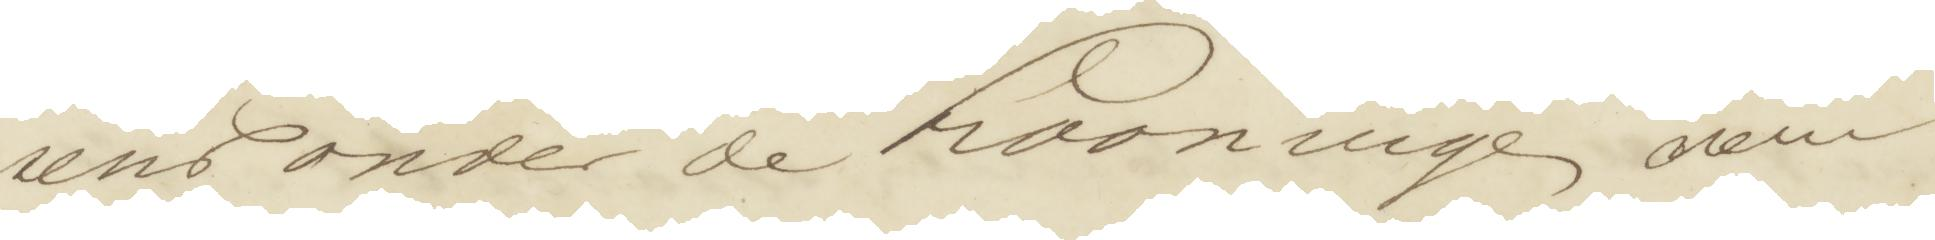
rens onder de kooningen van
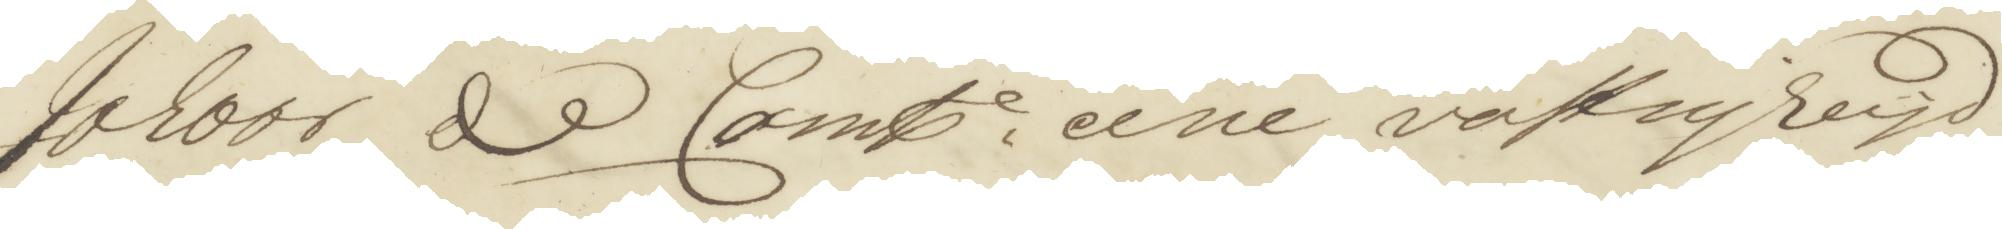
Johoor de Comp„e eene vastigheijd
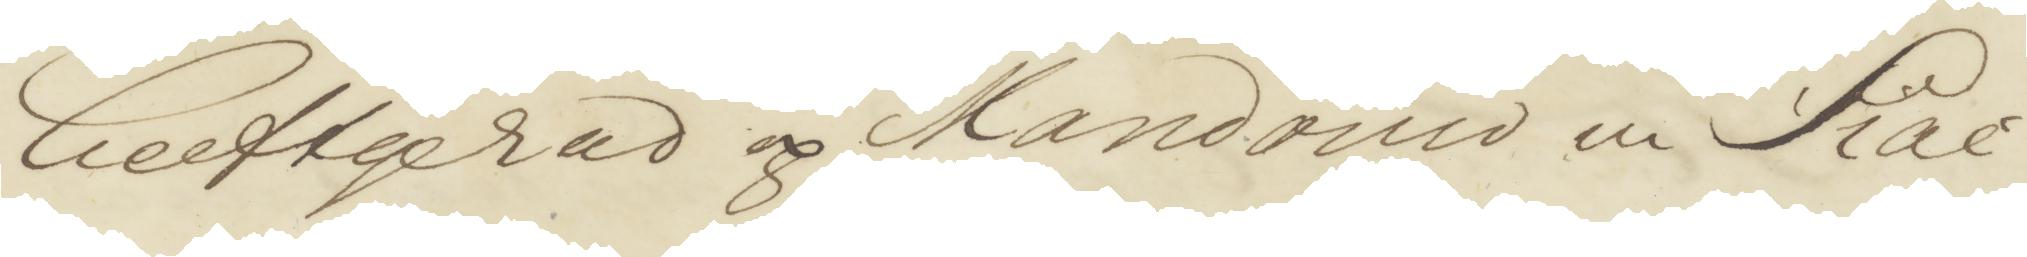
heeft gehad op Mandouw in Siac
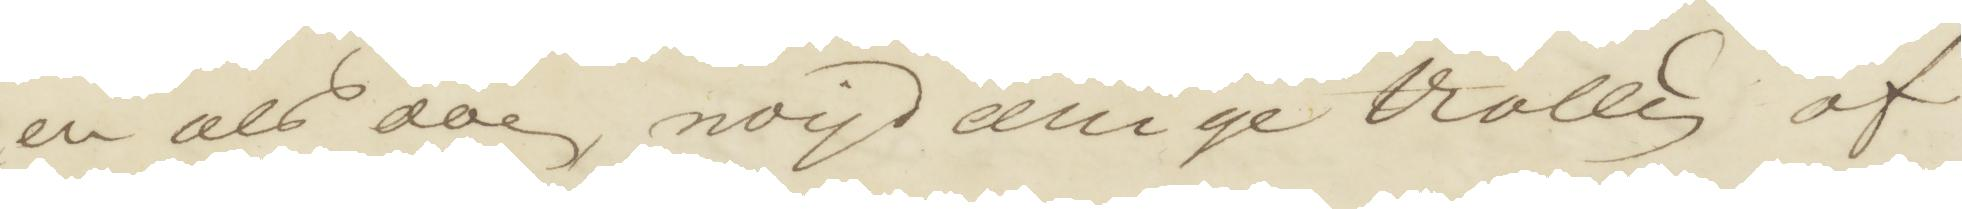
en als doen, noijd eenige thollen of
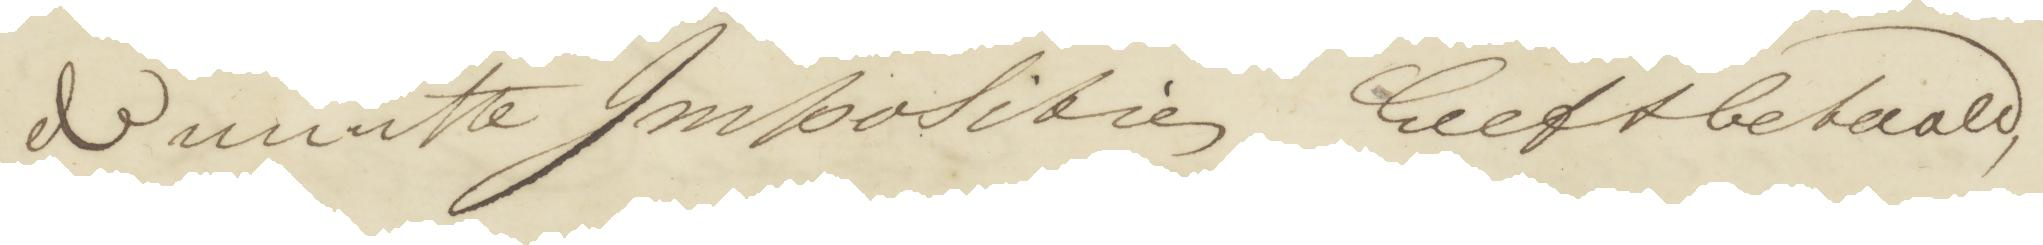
de minste Jmpositien heeft betaald,
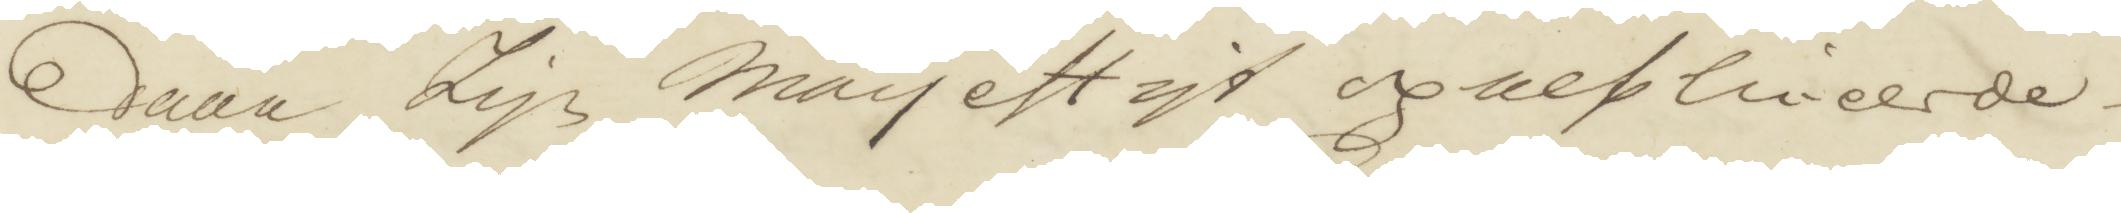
daar zijn maijestijt op repliceerde
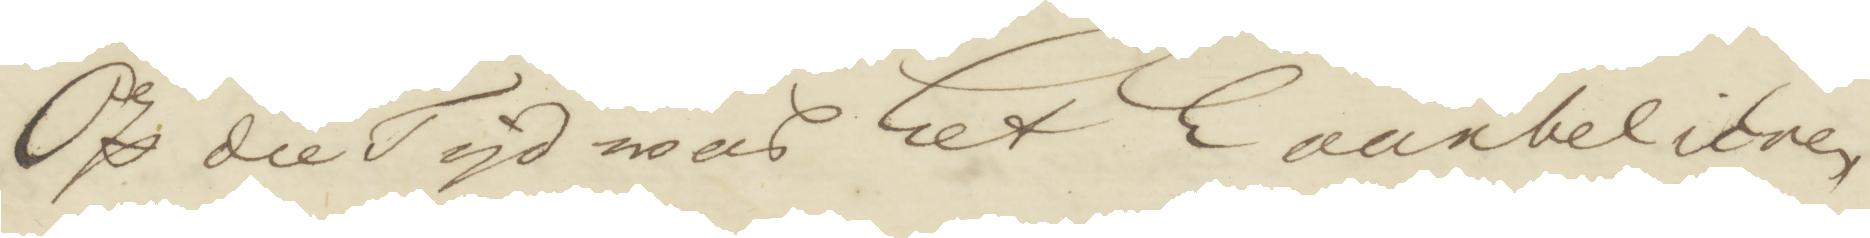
Op die Tijd was het haar believen,
